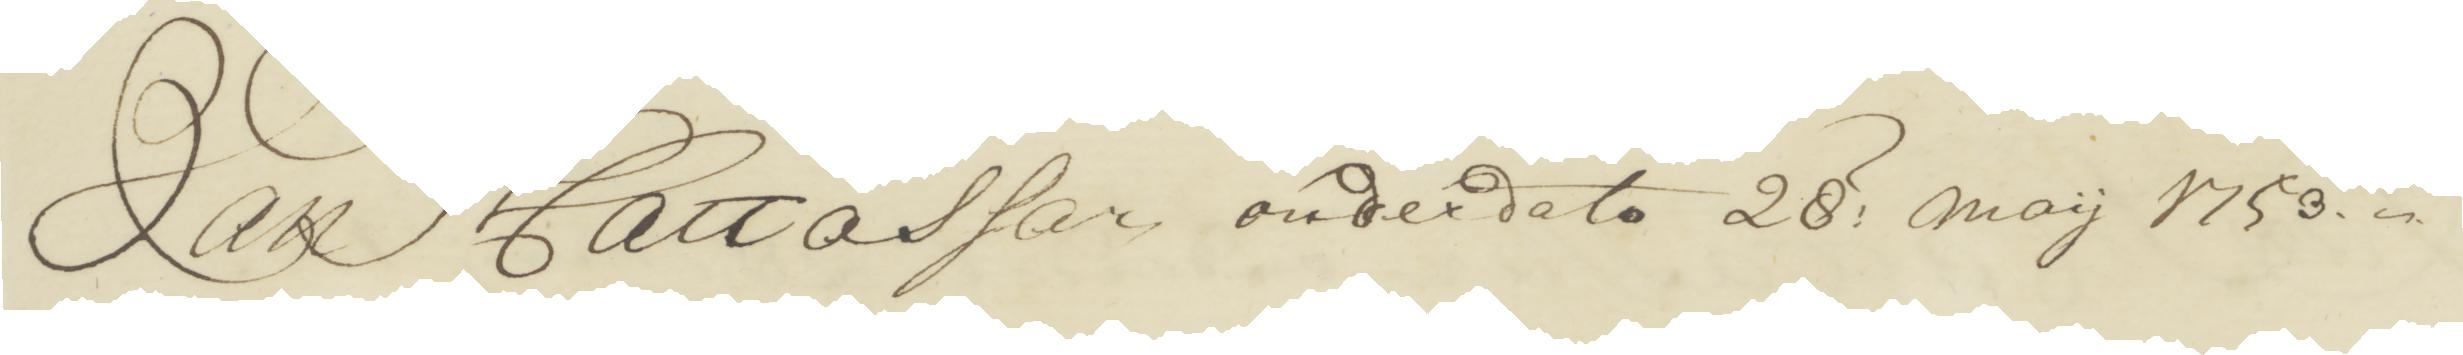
Van Maccassar onder dato 28:' maij 1753.~.
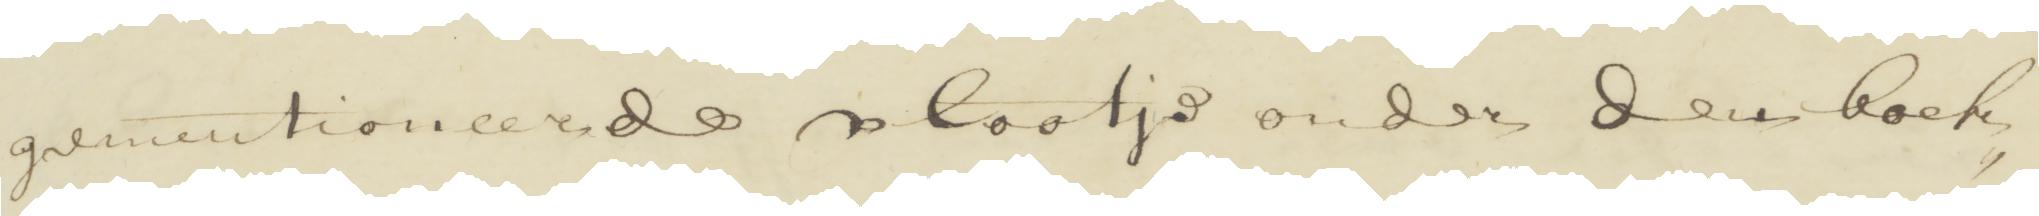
gementioneerde vlootje onder den boek„
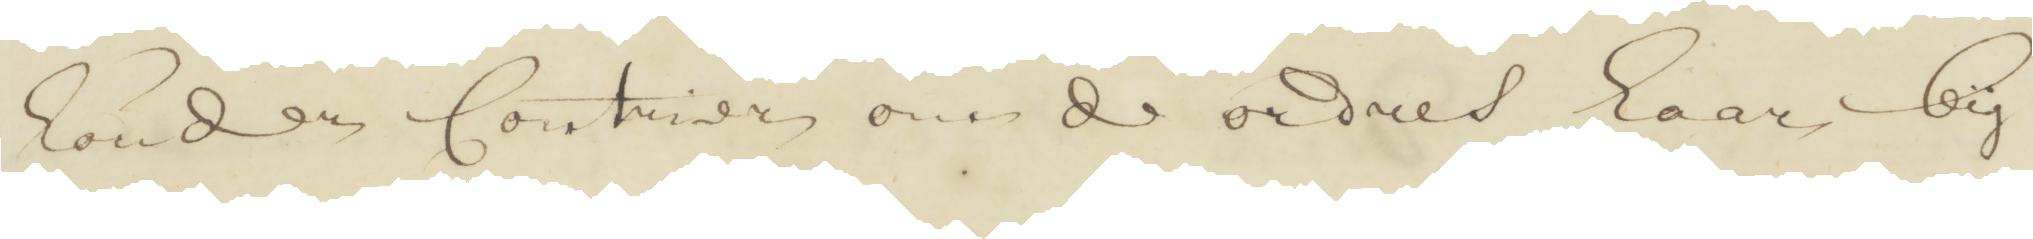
houder Coutrier om de ordres, haar bij
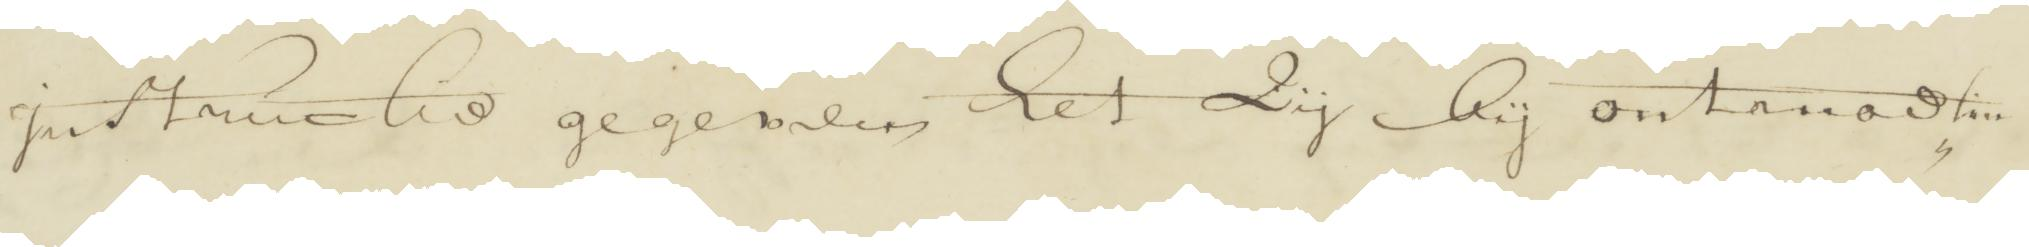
jnstructie gegeven het zij hij ontmoetin„
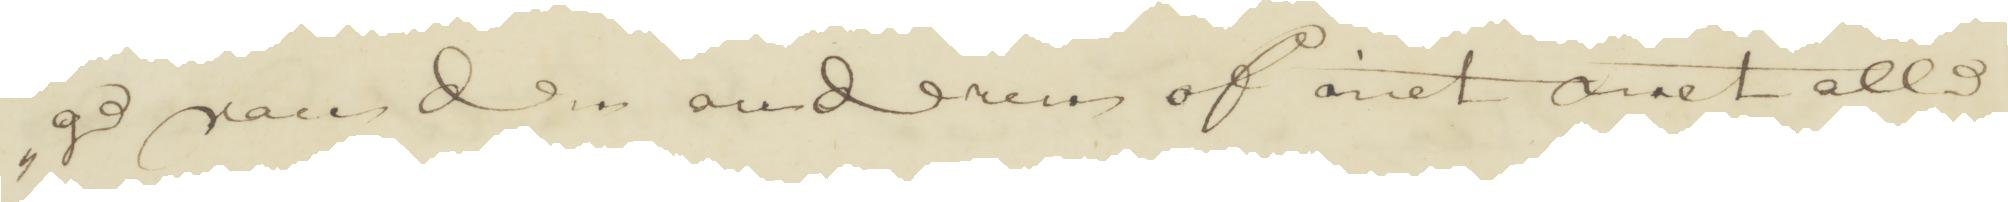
„ge van den anderen of niet met alle
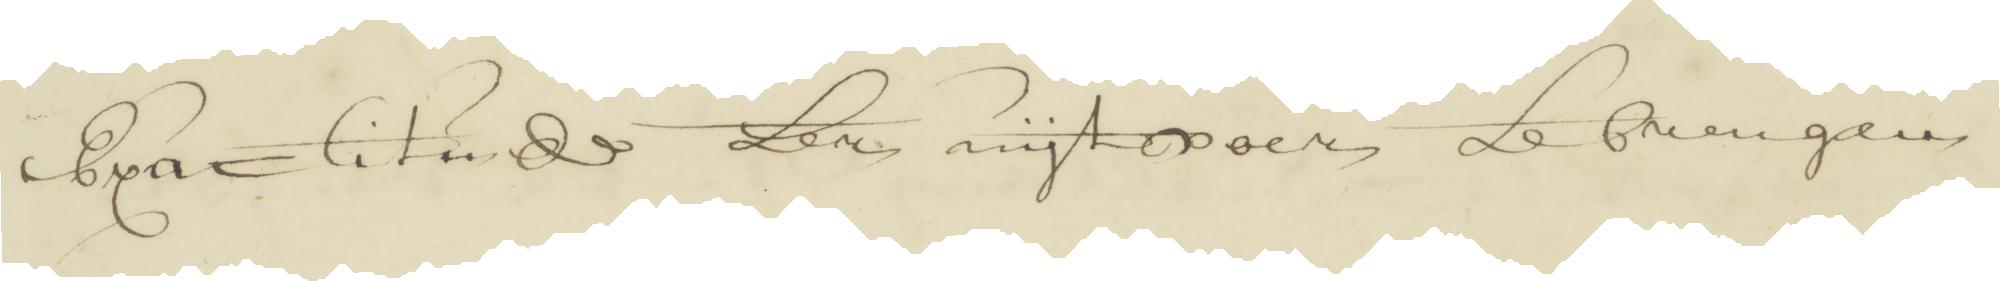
Exactitude ter uijtvoer te brengen,
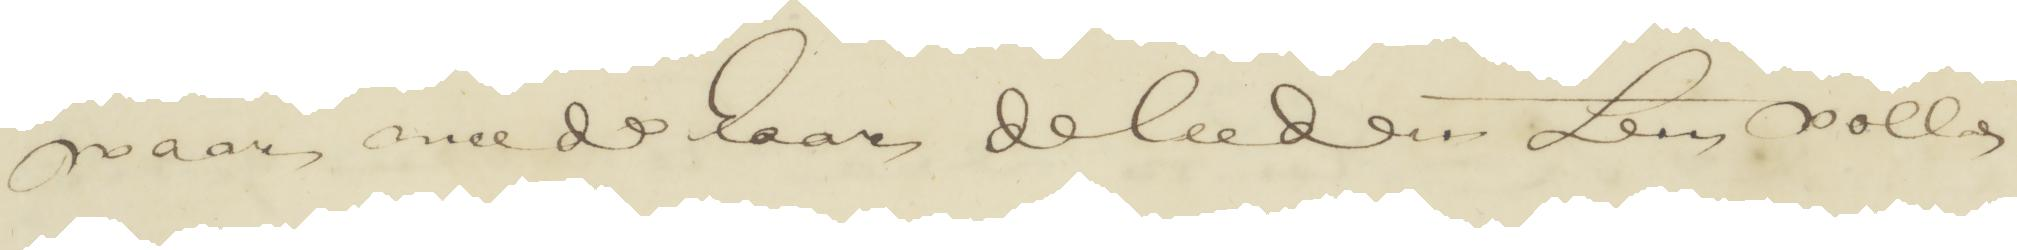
waar meede haar de leeden ten vollen
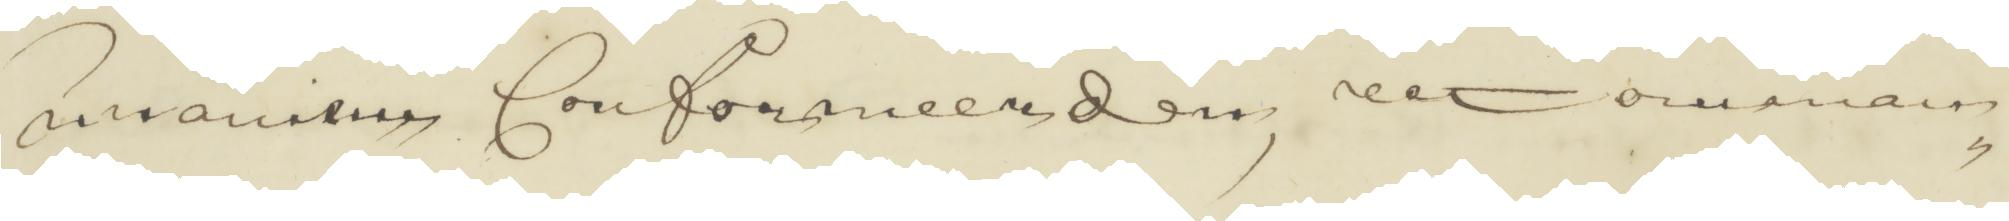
unaniem Conformeerden, recomman„
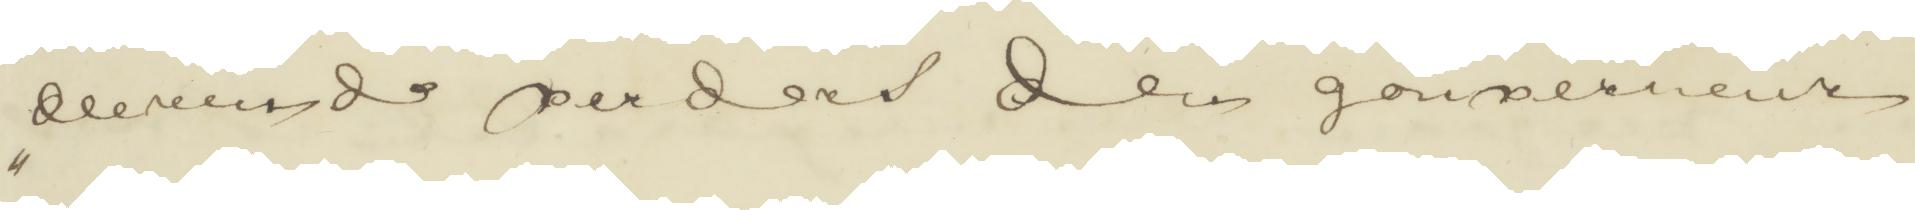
„deerende verders den gouverneur
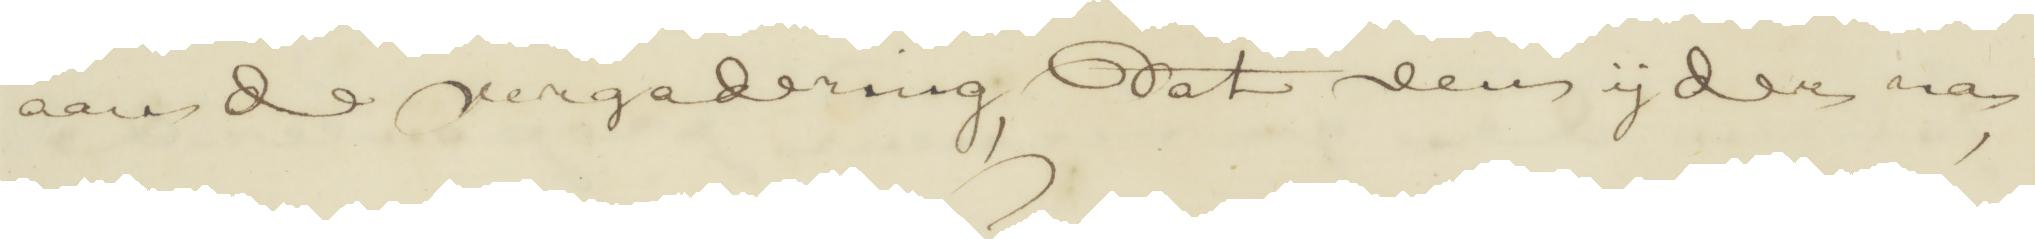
aan de vergadering, dat een ijder na,
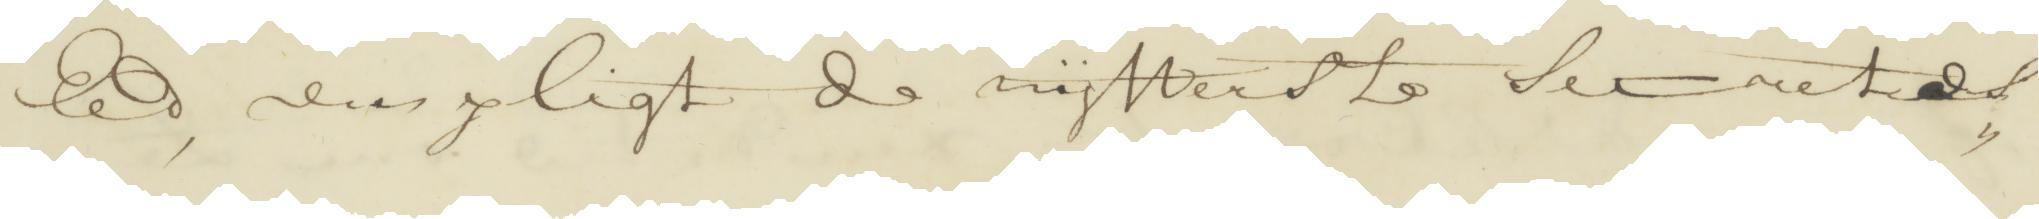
Eed, en pligt de uijtterste secretes„
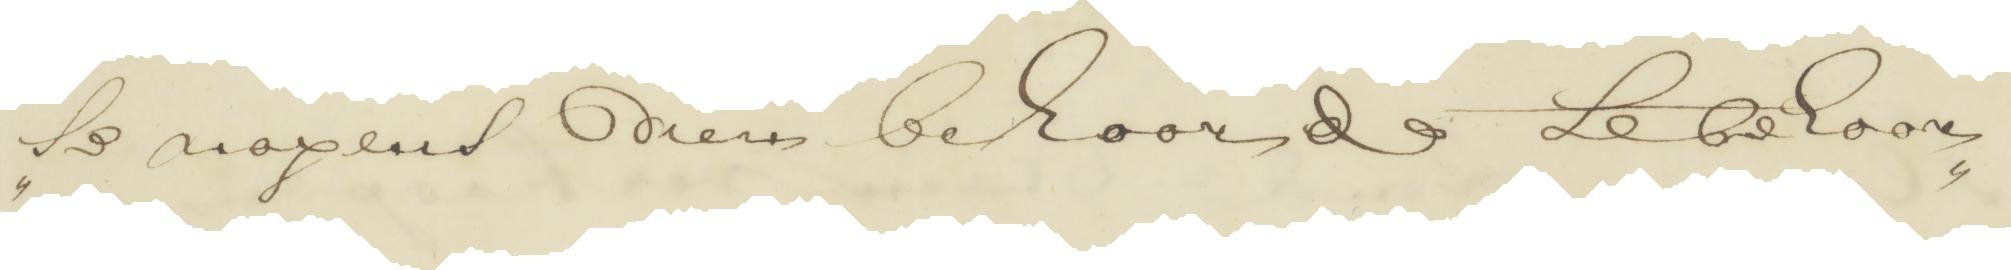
se nopens dien behoorde te behoor„
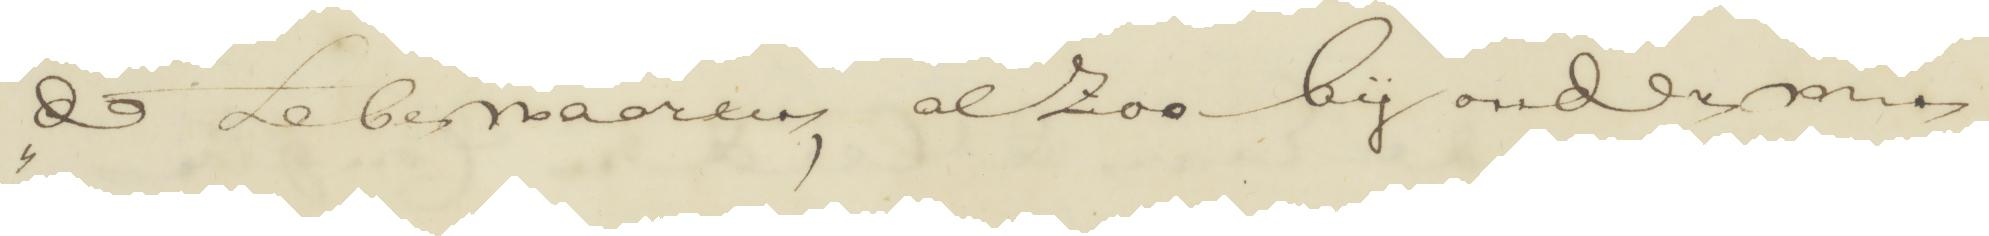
„de te bewaaren, alzoo bij onderwin
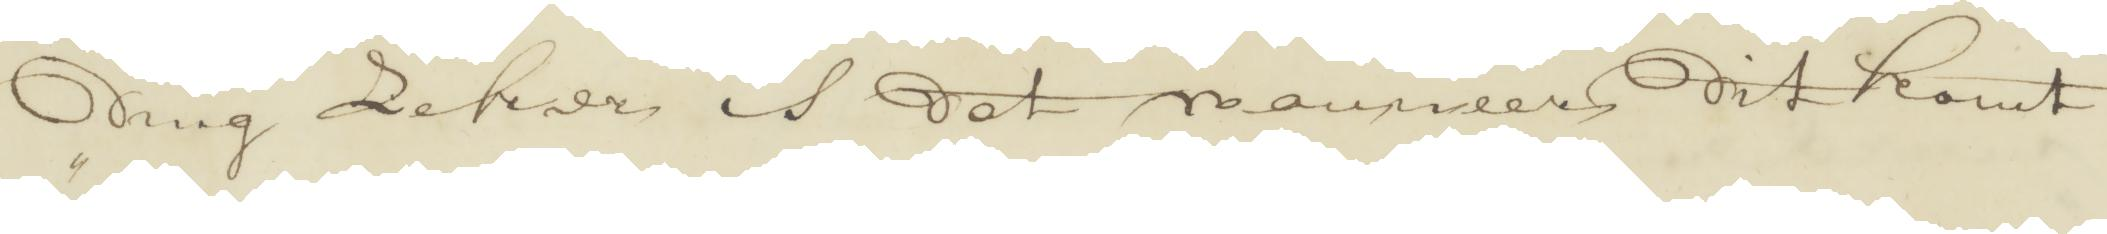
„ding zeker is dat wanneer dit komt
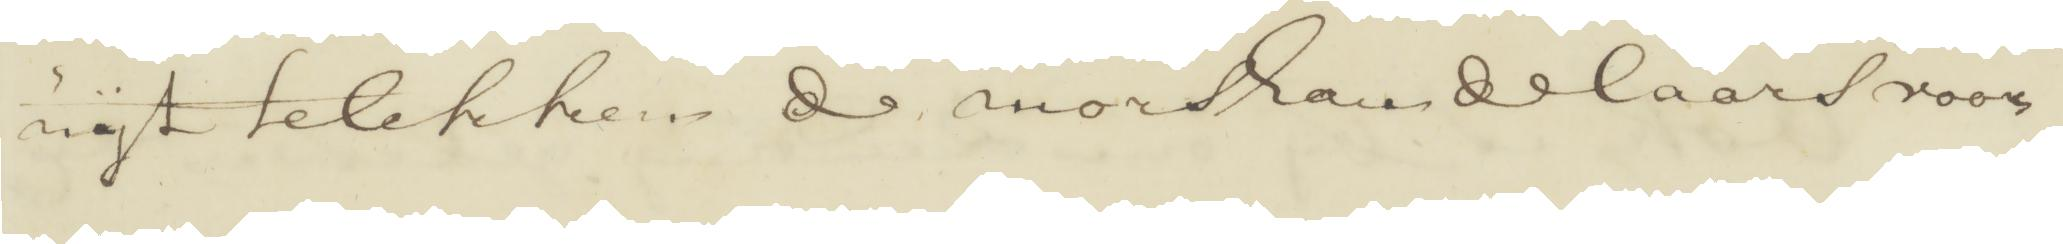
uijt telekken de morshandelaars voor
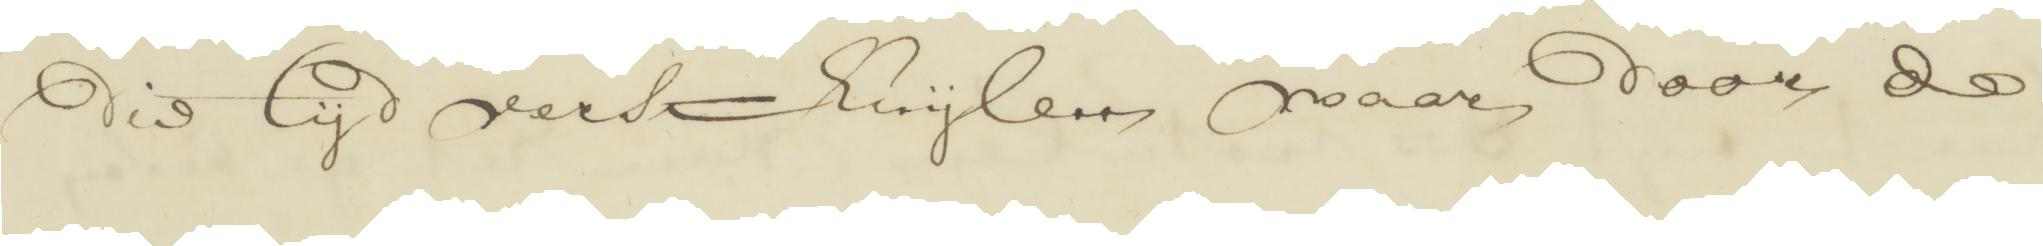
die tijd verschuijlen waar door de
